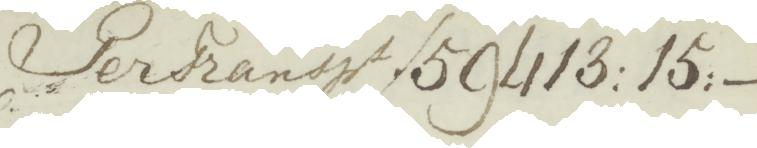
Per Transpt ƒ59413: 15:—
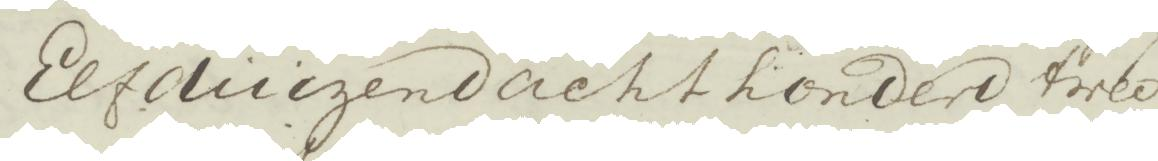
Elfduizend acht honderd twee
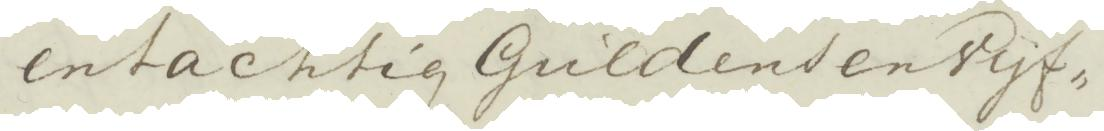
entachtig Guldens en Vijf„
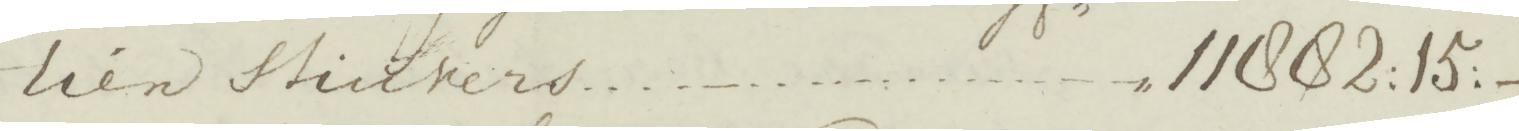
tien stuivers . . . . – . . . . . . . . . . . . – – „ 11882:15: —
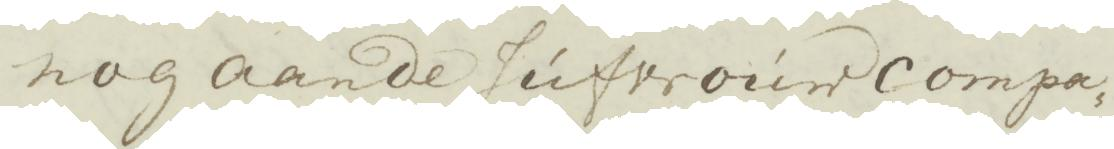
nog aan de Jufvrouw Compa„
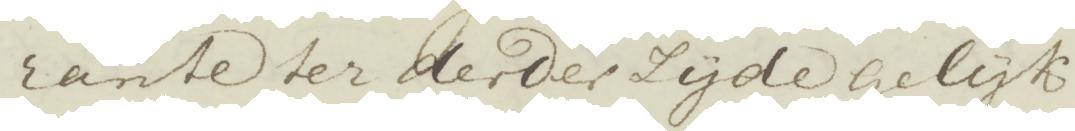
rante ter derder zijde gelijk
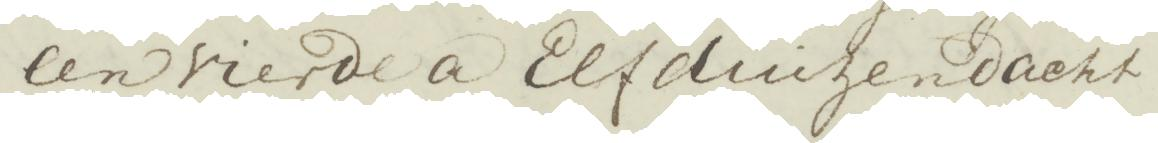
een vierde a Elf duizend acht
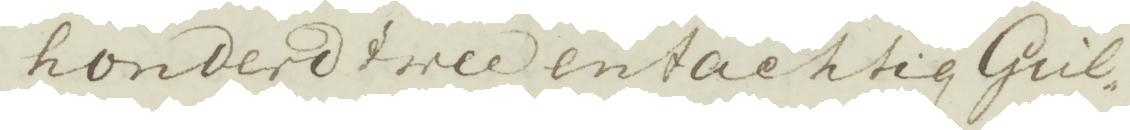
honderd twee entachtig Gul„
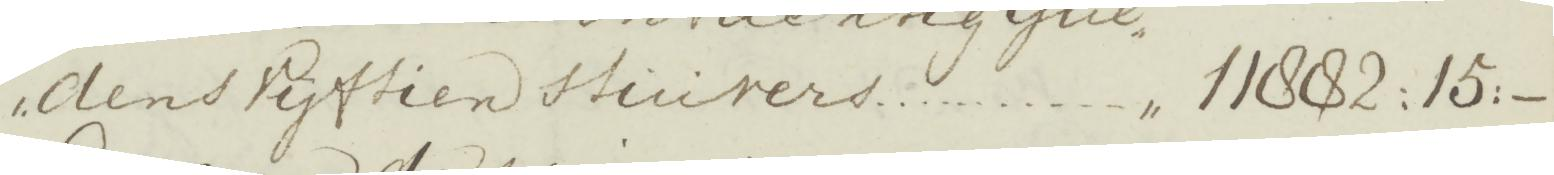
„dens Vijftien stuivers . . . . . . . . . . . „ 11882:15:—
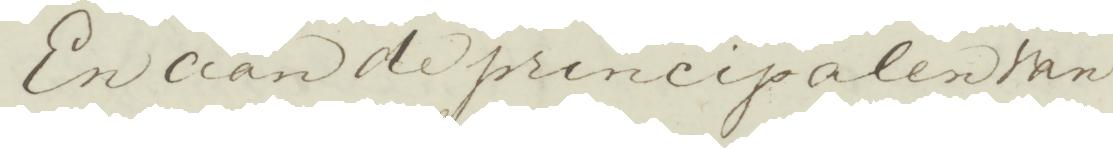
En aan de principalen van
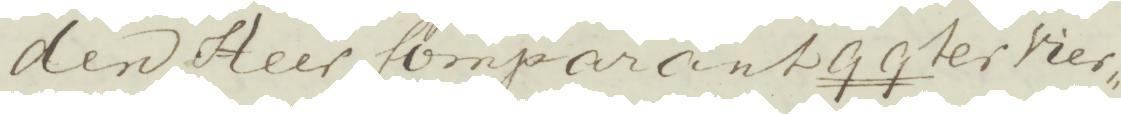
den Heer Comparant qq ter vier
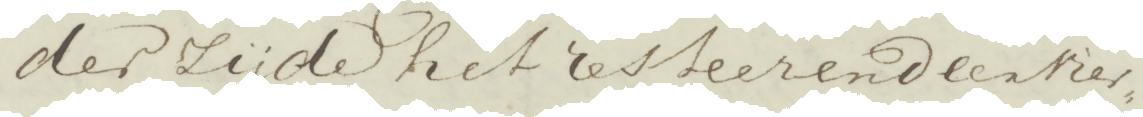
der zijde het resteerend een vier„
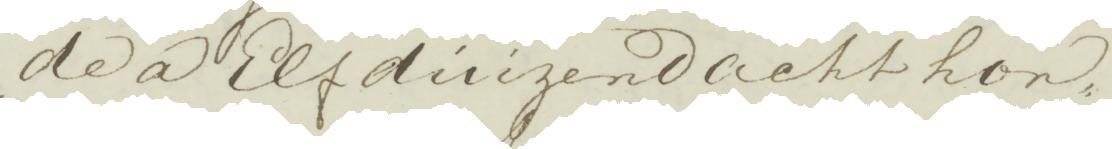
de a Elf duizend acht hon„
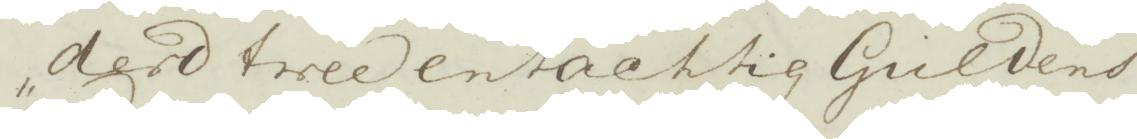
„derd twee en tachtig Guldens
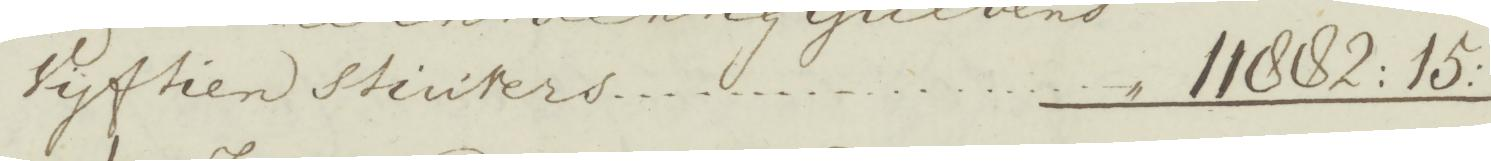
Vijftien stuivers . . . . . . . . - . . . . . . . . . „ 11882:15:
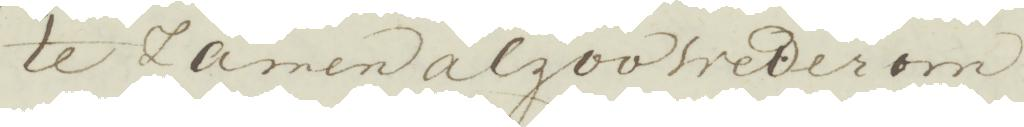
te zamen alzoo wederom
